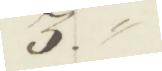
3. „
